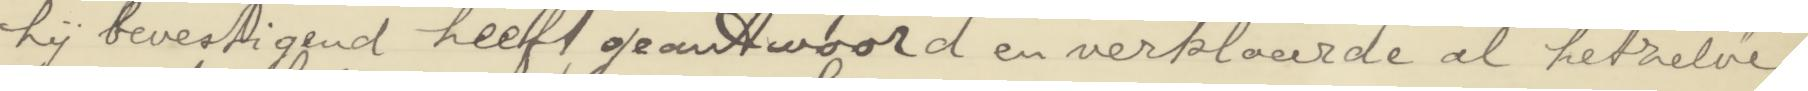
hij bevestigend heeft geantwoord en verklaarde al hetzelve
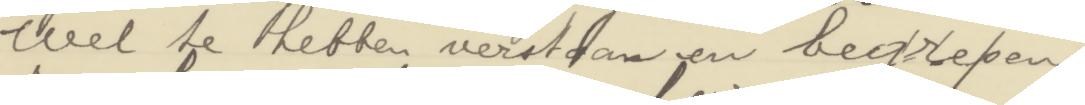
wel te hebben verstaan en begrepen.
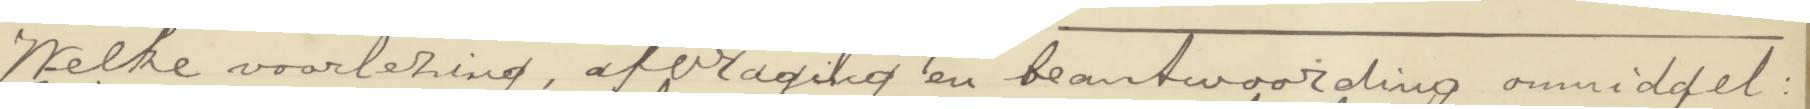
Welke voorlezing, afvraging ten beantwoording onmiddel:
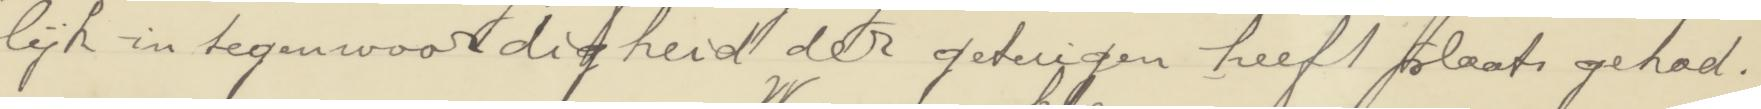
lijk in tegenwoordigheid der getuigen heeft plaats gehad.
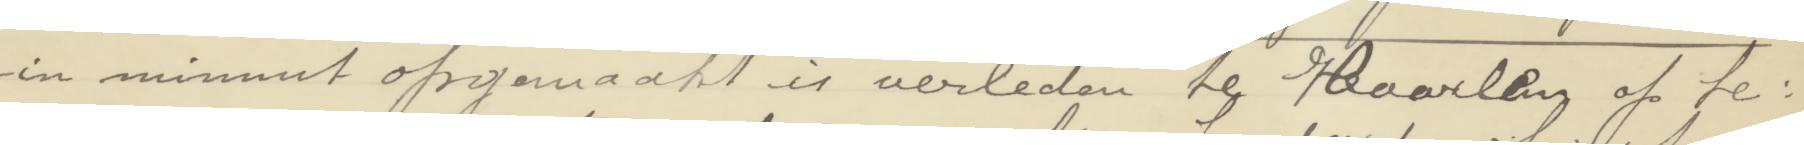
in minuut opgemaakt is verleden te Haarlem op he:
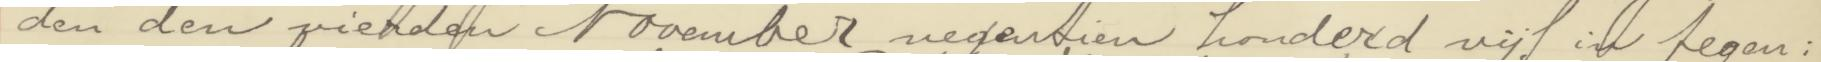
den den vierden November negentien honderd vijf in tegen:
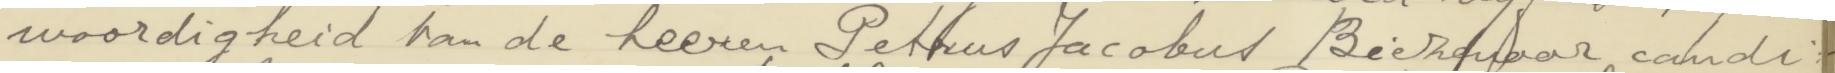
woordigheid van de heeren Petrus Jacobus Biezenaar candi„
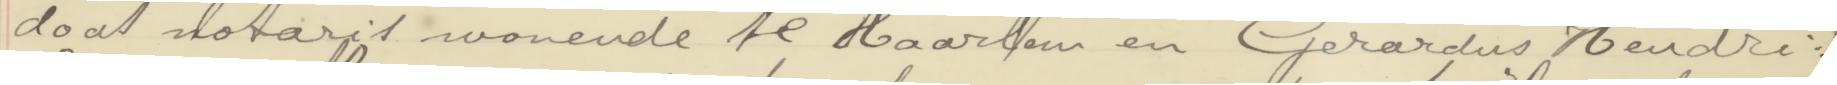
daat notaris wonende te Haarlem en Gerardus Hendri„
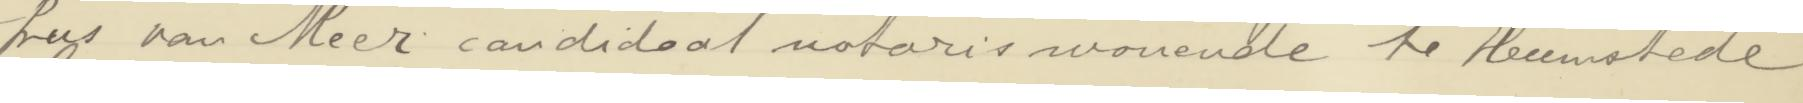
kus van Meer candidaat notaris wonende te Heemstede
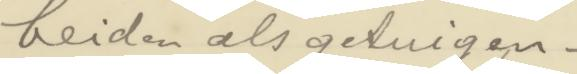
beiden als getuigen.
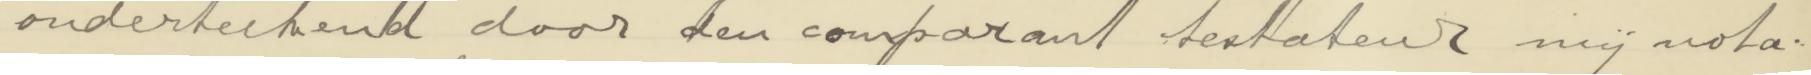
onderteekend door den comparant testateur mij nota:
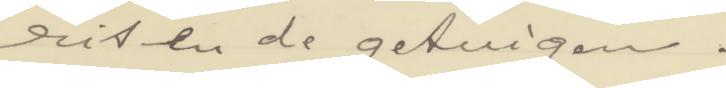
ris en de getuigen
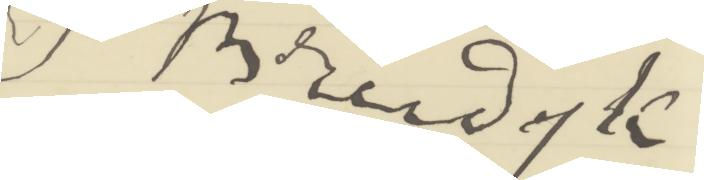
P Breedyk
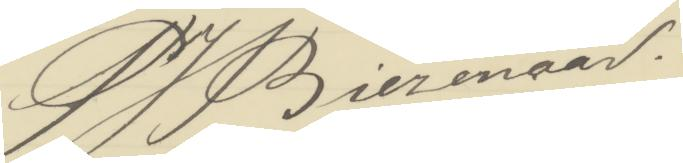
PJ Biezenaar.
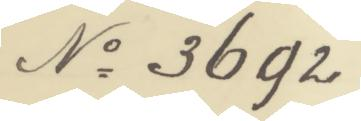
N=o 3692
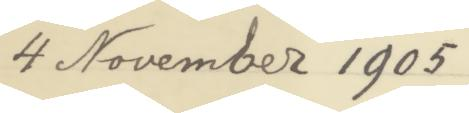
4 November 1905
